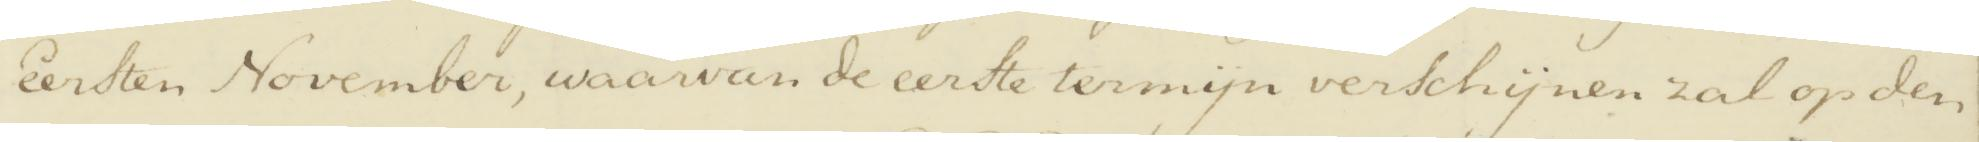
Eersten November, waarvan de eerste termijn verschijnen zal op den
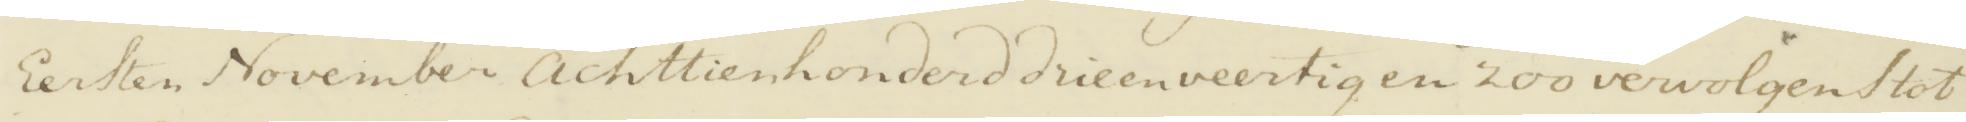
Eersten November Achttien honderd drieenveertig en zoo vervolgens tot
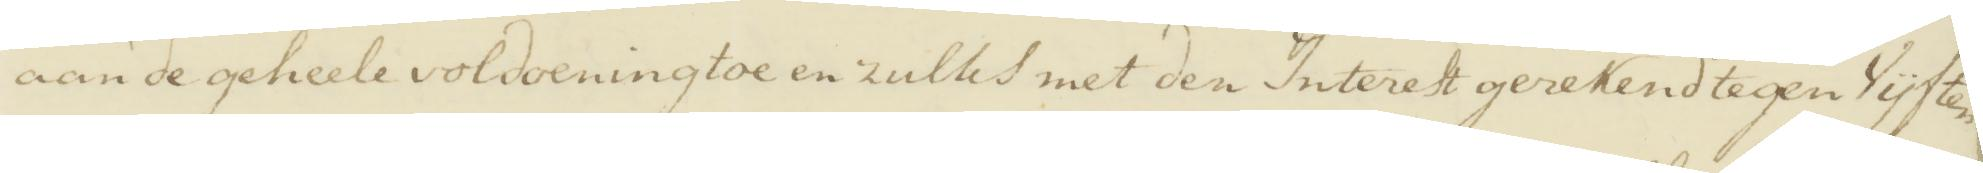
aan de geheele voldoening toe en zulks met den Interest gerekend tegen Vijften
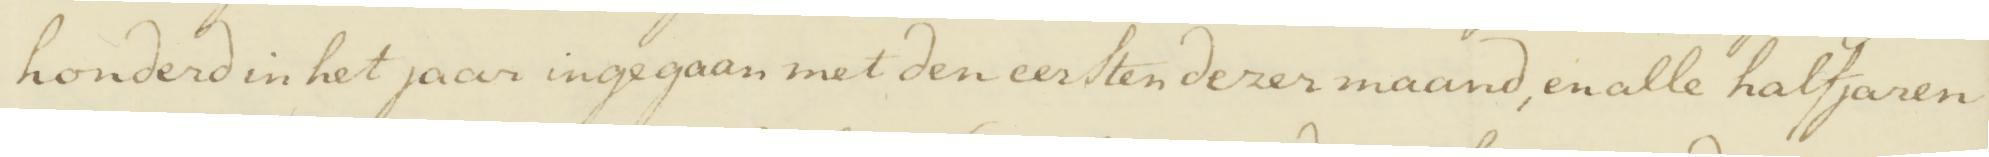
honderd in het jaar ingegaan met den eersten dezer maand, en alle halfjaren
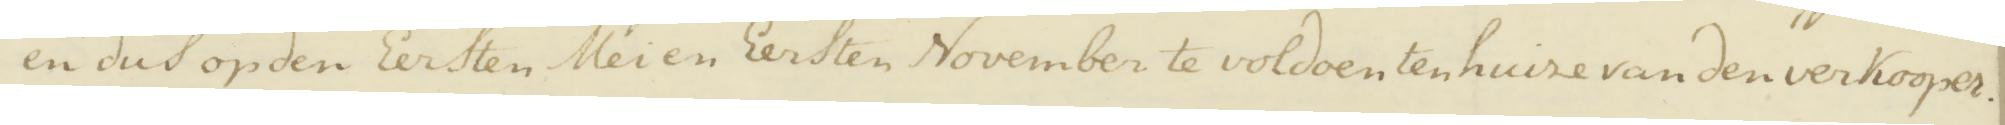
en dus op den Eersten Mei en Eersten November te voldoen ten huize van den verkooper.
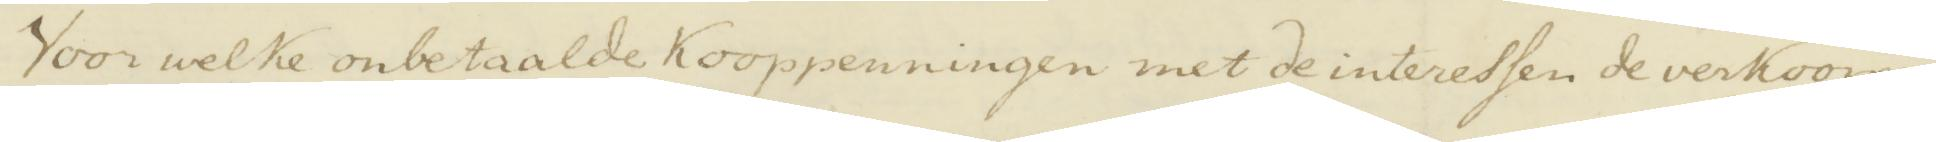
Voor welke onbetaalde Kooppenningen met de interessen de verkooper
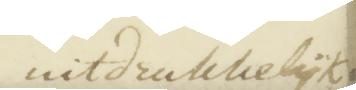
uitdrukkelijk
